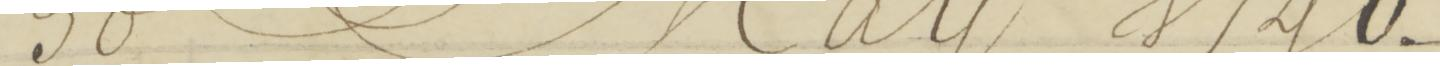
30 Maij 1740.
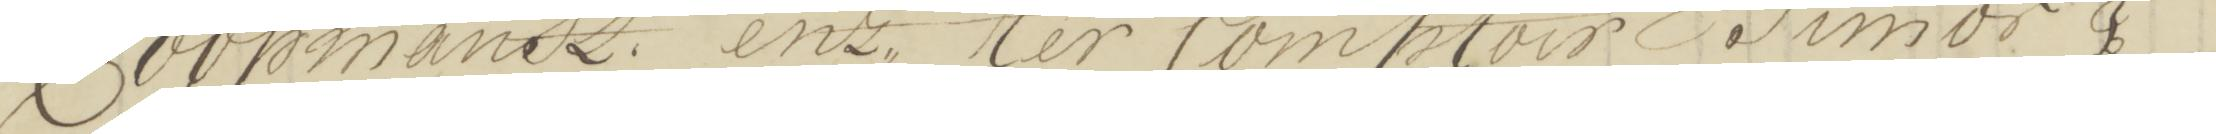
Coopmansz. enz„ ter Comptoir Timor
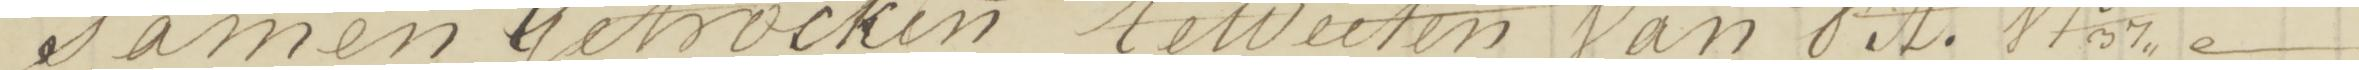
samen getrocken teweeten van d' A.s 1736/37„ —
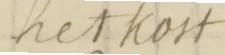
het kost
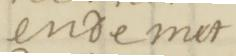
ende met
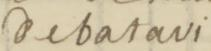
de batavi
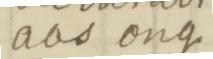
aos ong
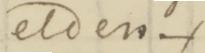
elden —
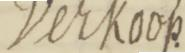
Verkoop:t
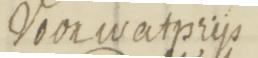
Voor wat prijs
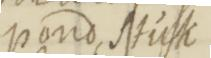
pond stuk
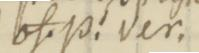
of p„s ver„
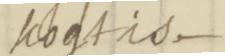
kogt is —
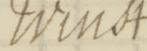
Winst
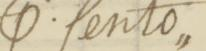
p.ro Cento„
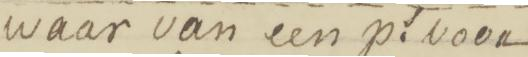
waar van een p.s voor
